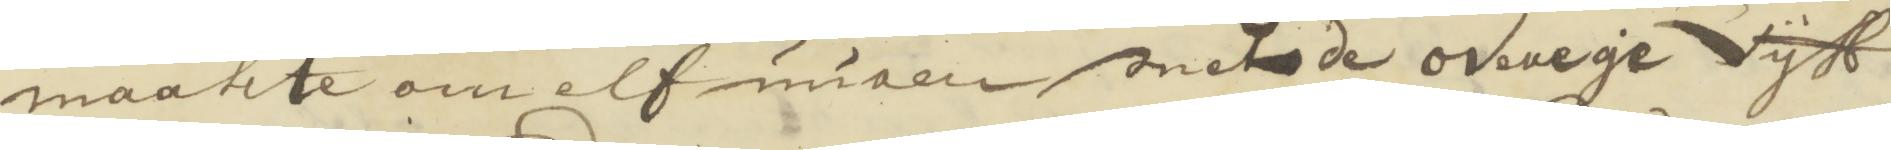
maakte om elf uuren met de overige vijff
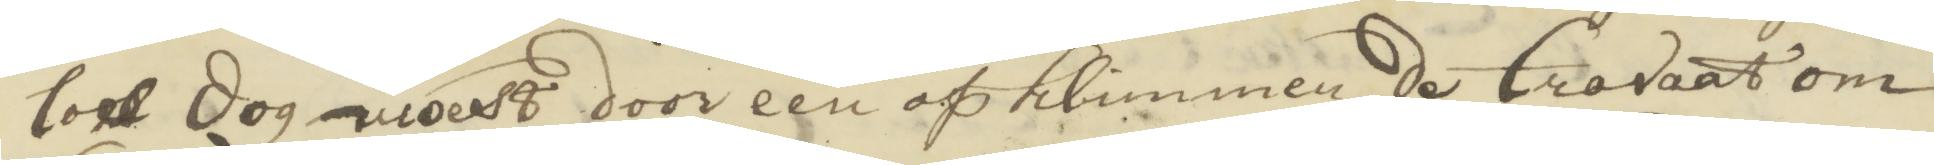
Cos dog moest door een op klimmen de travaat om
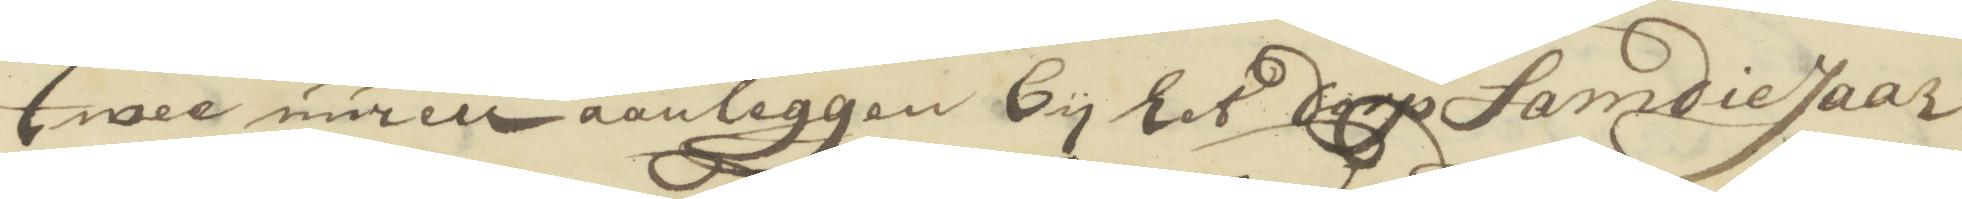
twee uuren aanleggen bij het dorp Samdie Jaar
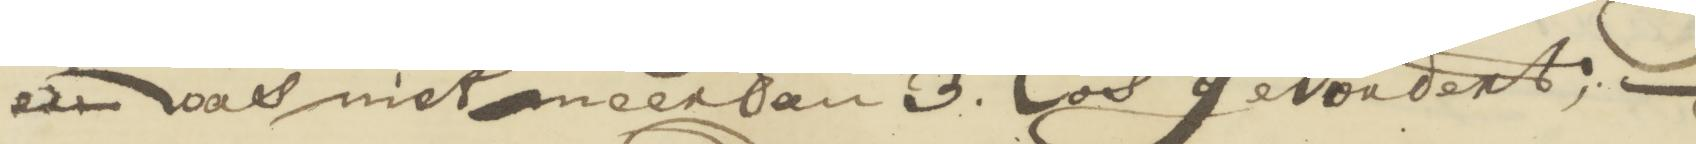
en was niet meer dan 3. Cos gevordert;.
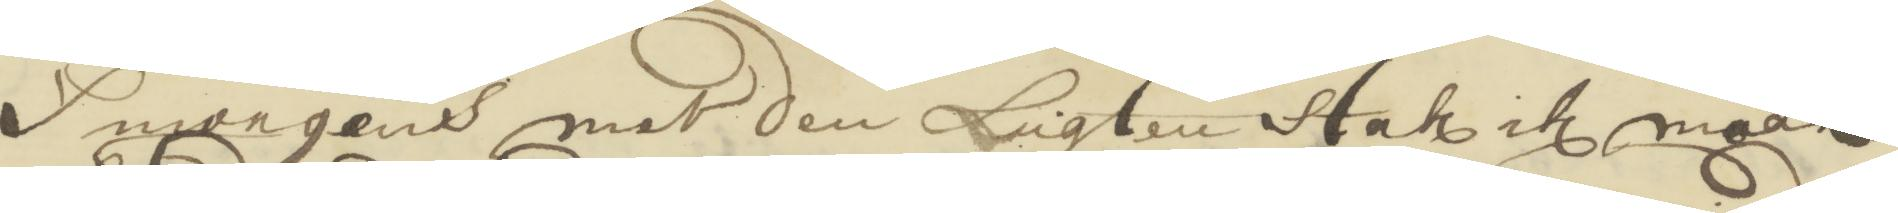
'S morgens met den Ligten stak ik maar
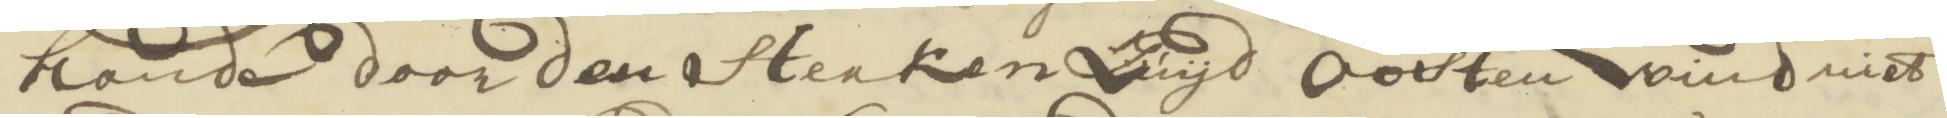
konde door den sterken zuijd Oosten wind niet
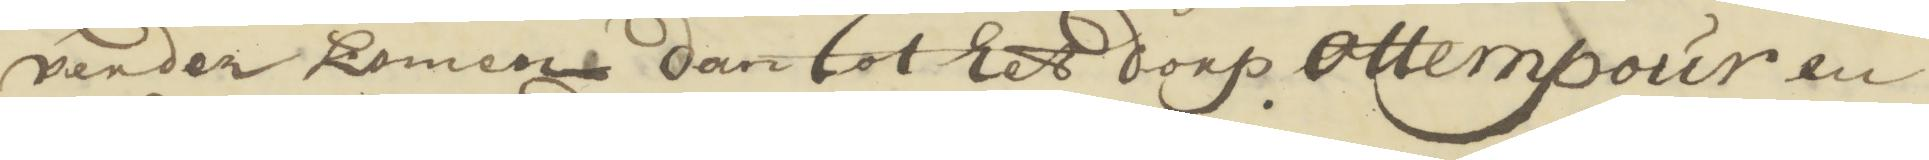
verder komene dan tot het dorp ottempour en
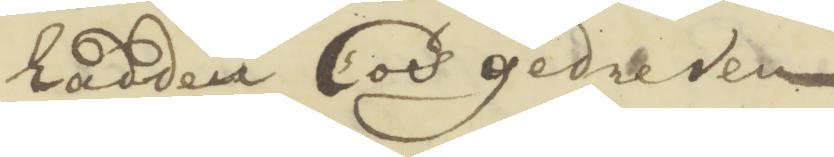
hadden Cos gedreven
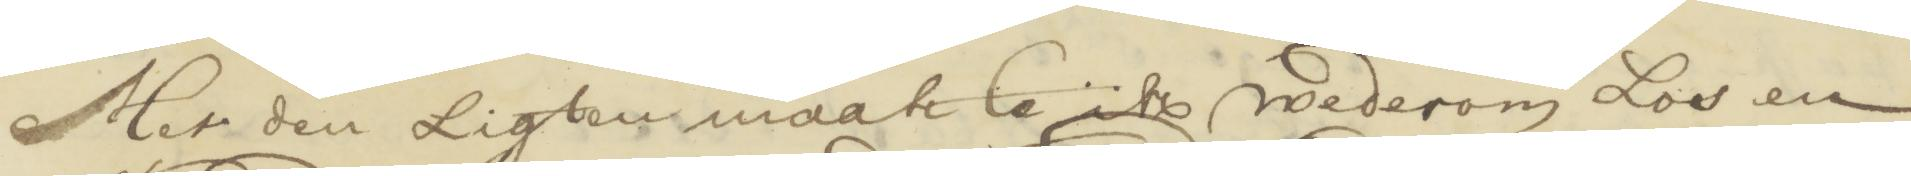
Met den ligten maakte ik wederom Los en
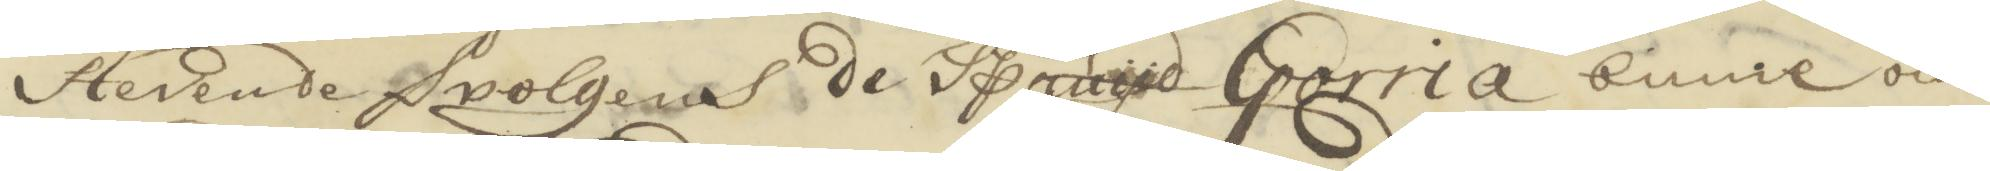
stevende vervolgens de spruijd Gorria binne om
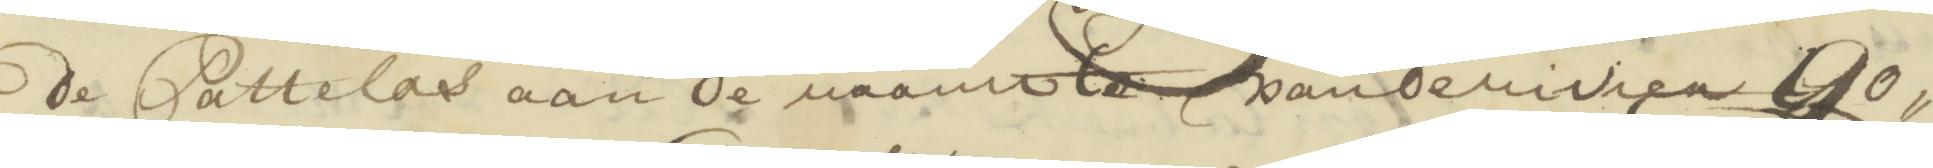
de Pattelas aan de naauwte van de rivier Go„
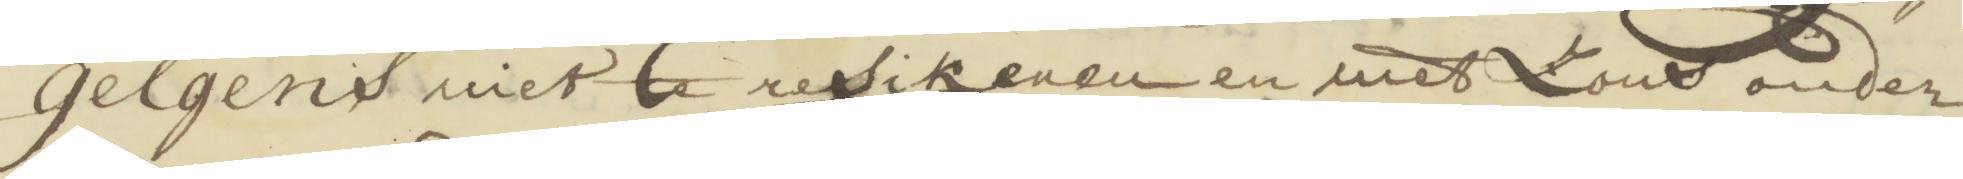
gelgens niet te resikeren en met zons onder
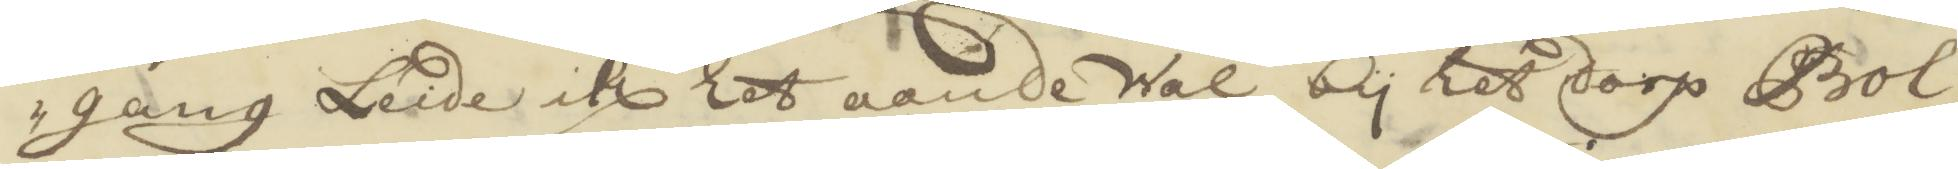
„gang Leide ik het aande wal bij het doop Bol
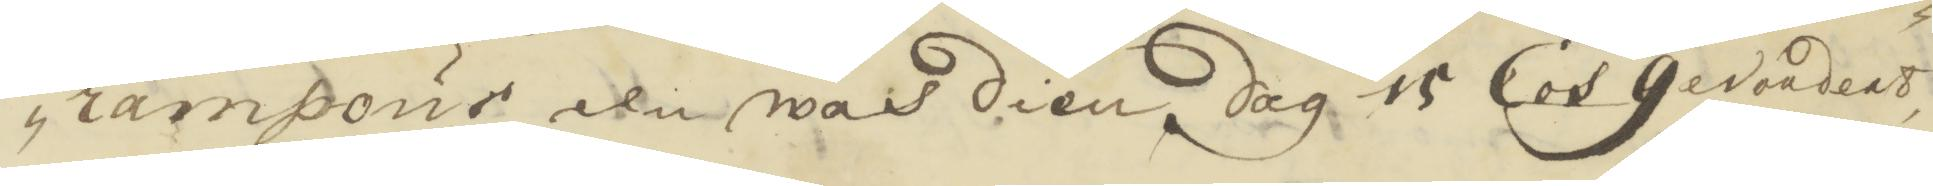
„rampour en was dien dag 15 Cos gevordert,
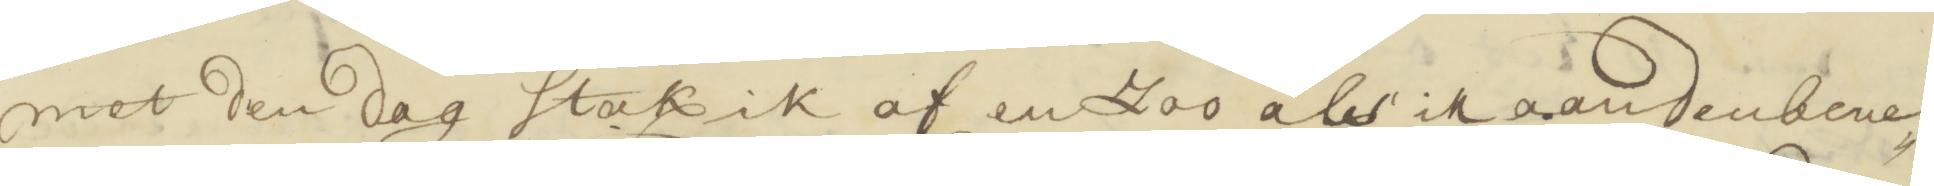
met den dag stak ik af en zoo als ik aan den bene„
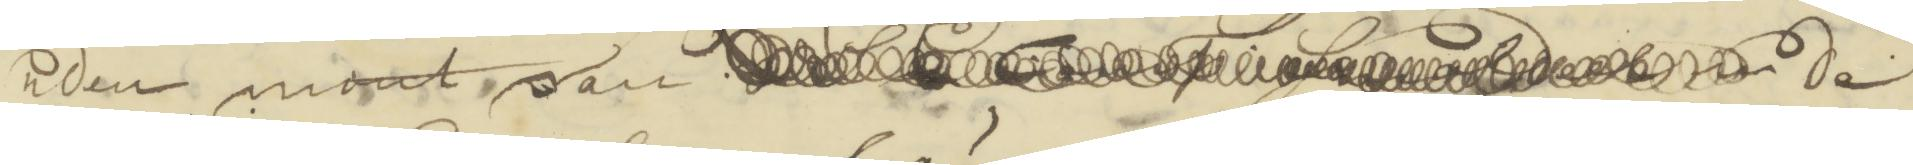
den mont, van 'S E Comp:s smaldeel in de
